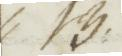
„ 13:
